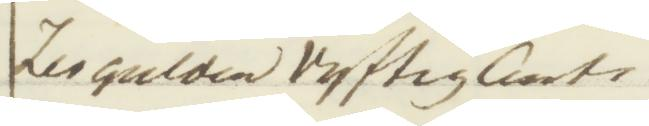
Zes gulden Vyftig Cents
